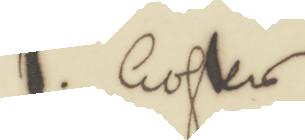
1. koster
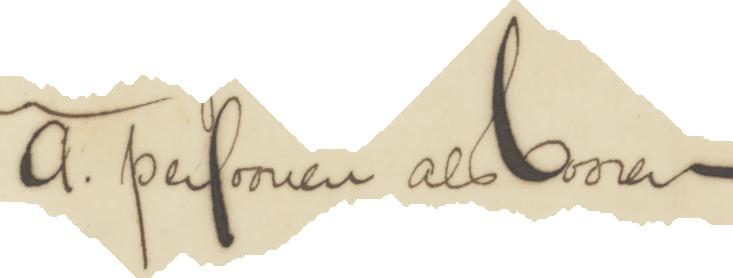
4. persoonen als Vooren
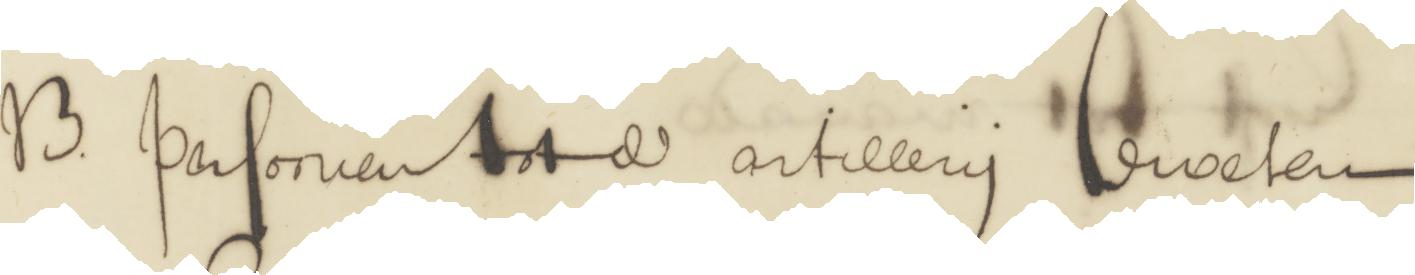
13. persoonen tot de artillerij teweten
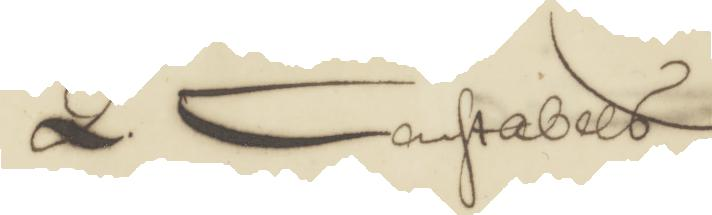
2. Constabels
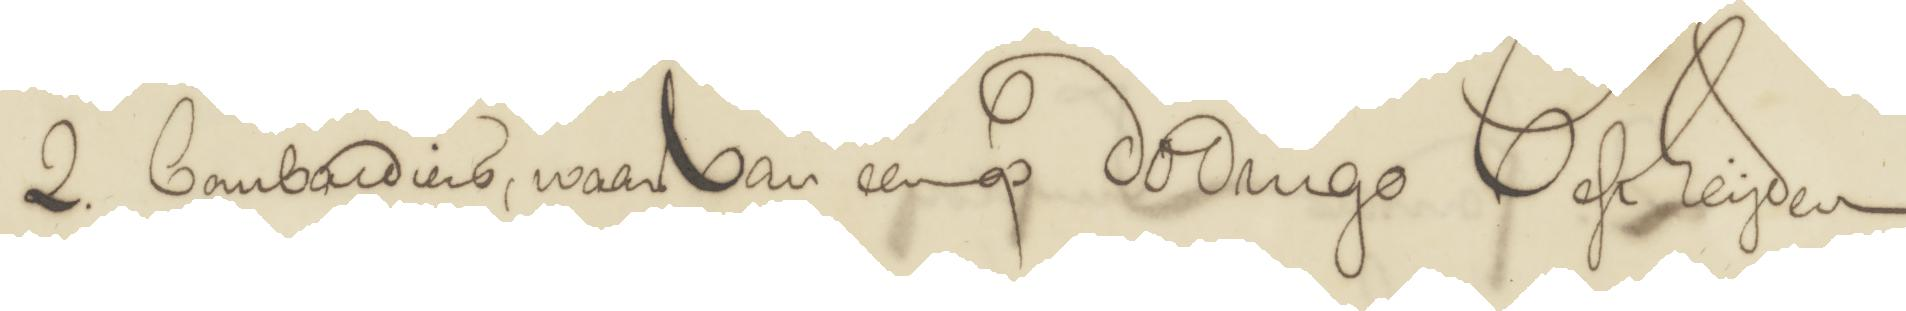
2. bombardiers, waar van een op dodingo bescheijden
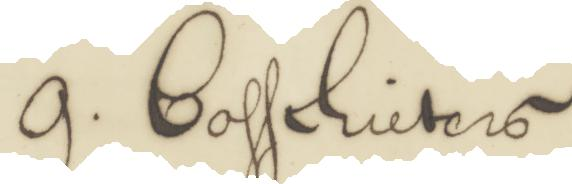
9. bosschieters
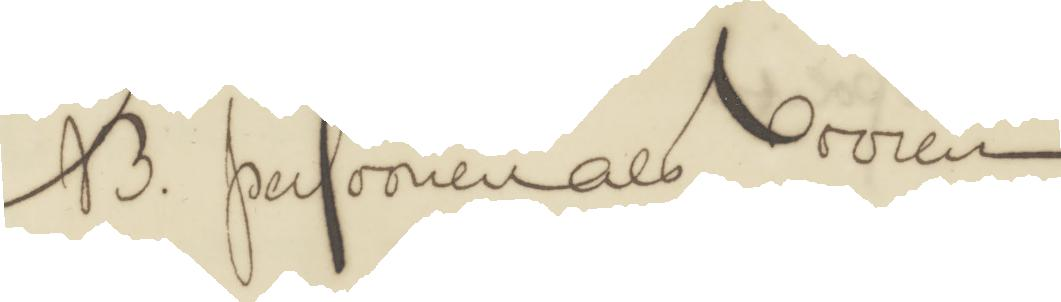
13. persoonen als Vooren
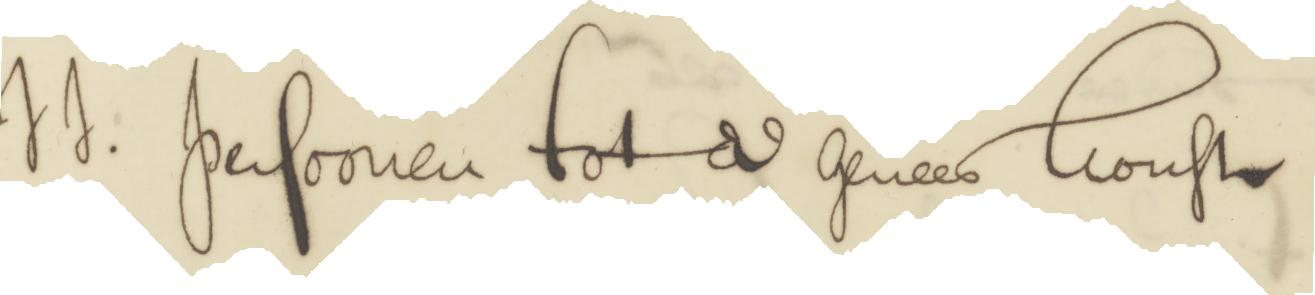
11. persoonen tot de geneeskonste
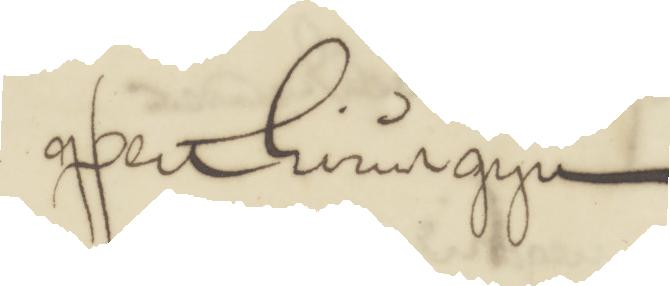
1. opperchirurgijn
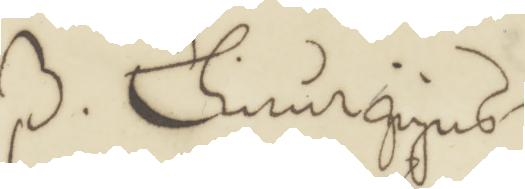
3. Chirurgijns
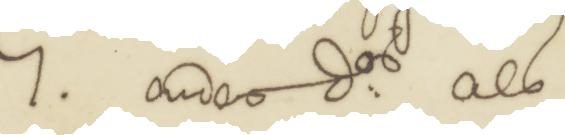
7. onder d:os als
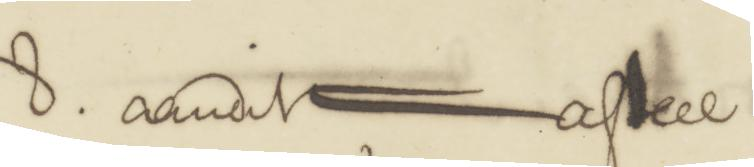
8. aandit Casteel
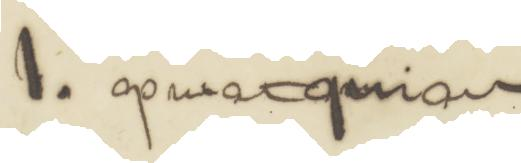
1. op macquian
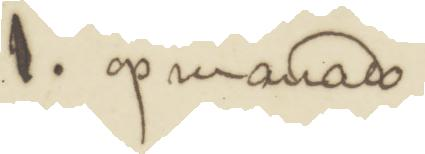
1. op manado
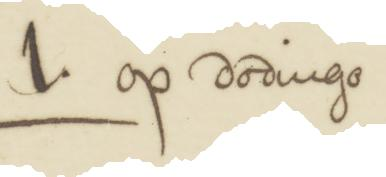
1. op dodingo
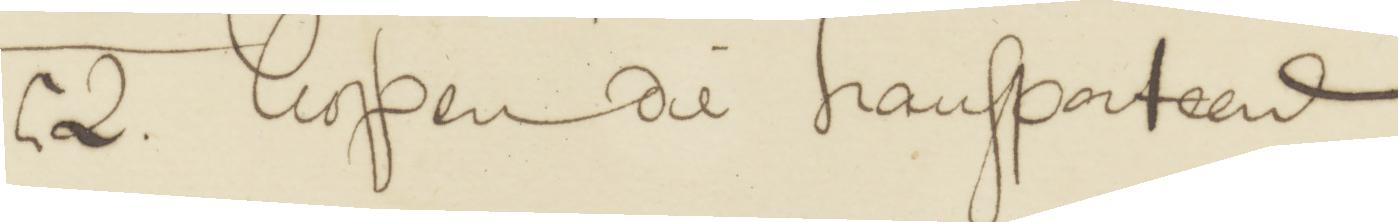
52. koppen die transporteere
